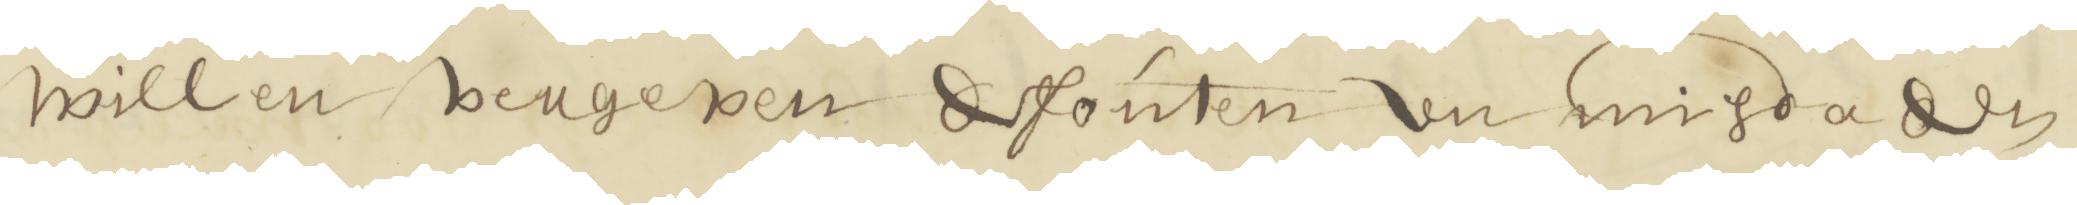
willen vergeven de fouten en misdaden
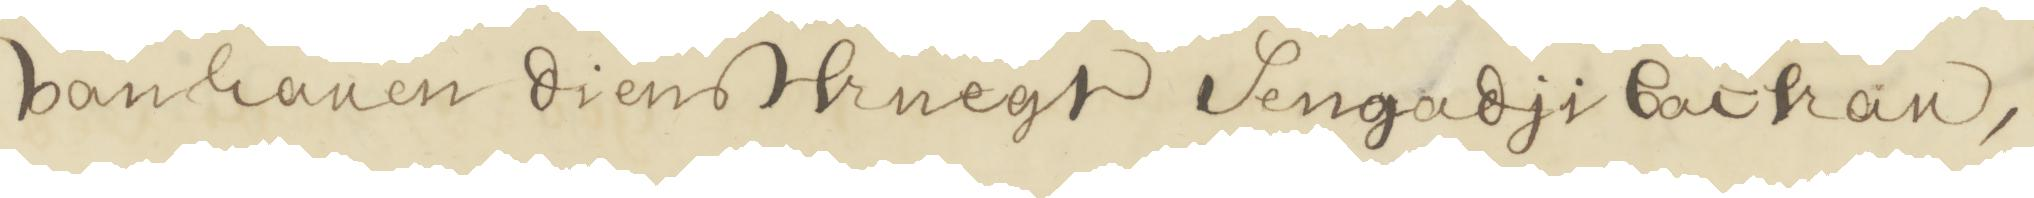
van haren dienstknegt Sengadji backar,
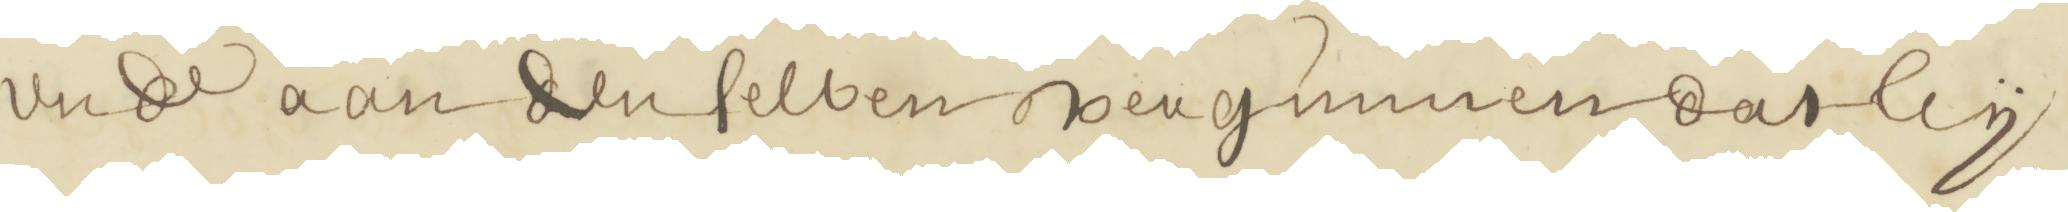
ende aan denselven vergunnen dat hij
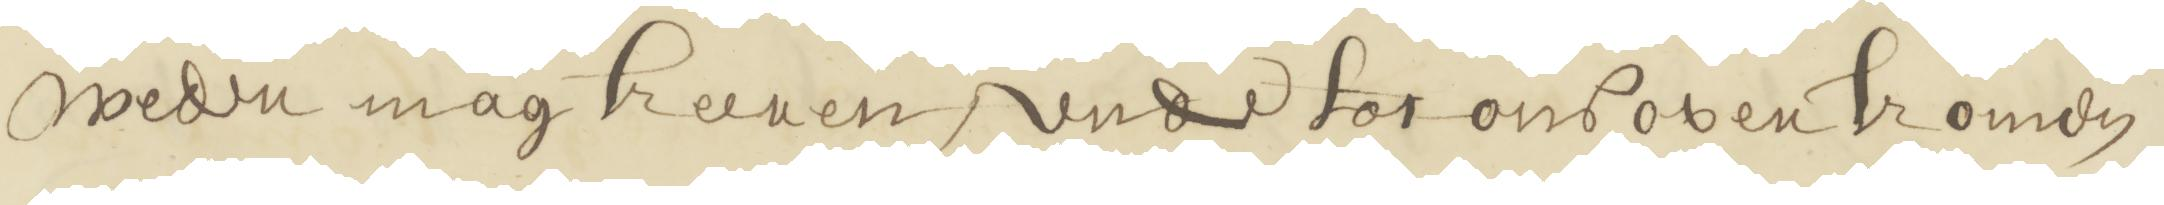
weder mag keeren, ende tot ons over komen
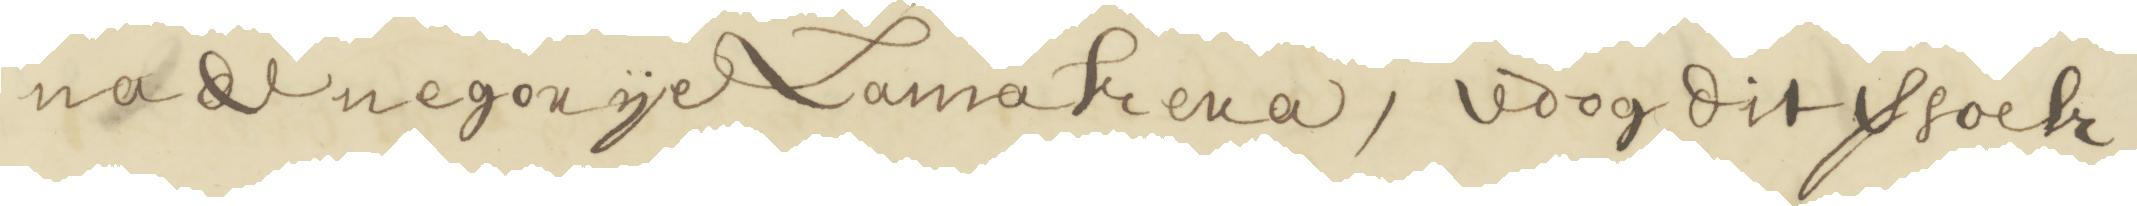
na de negorije Lamakera, edog dit versoek
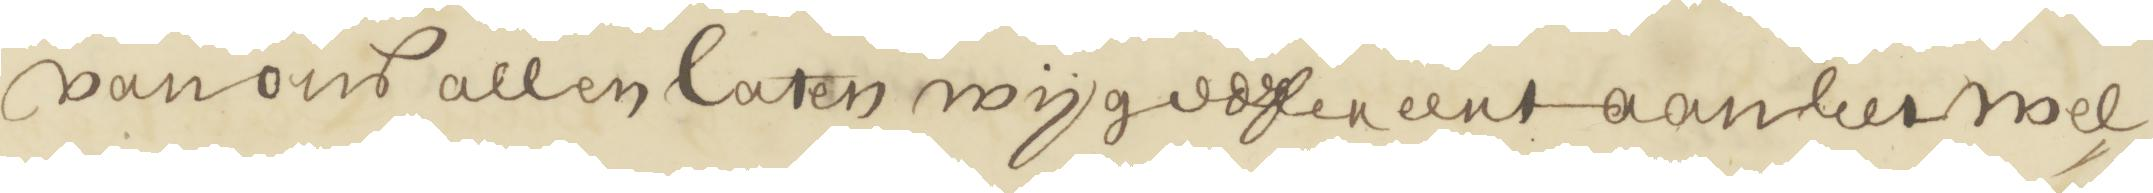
van ons allen laten wij gedefereert aan het wel„
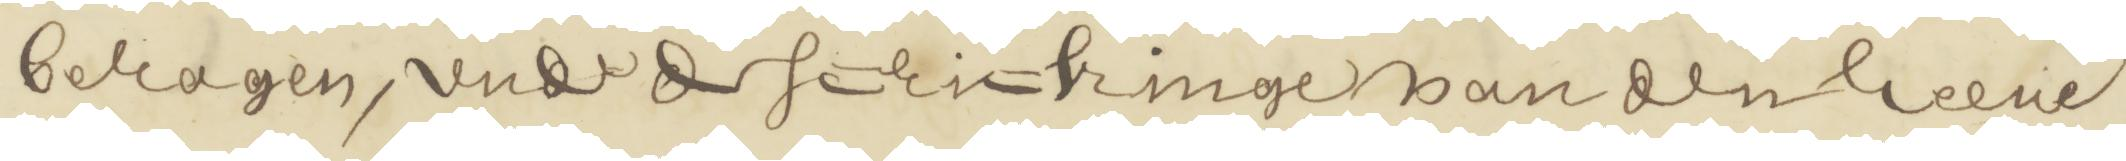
behagen, ende de schickinge van den heere
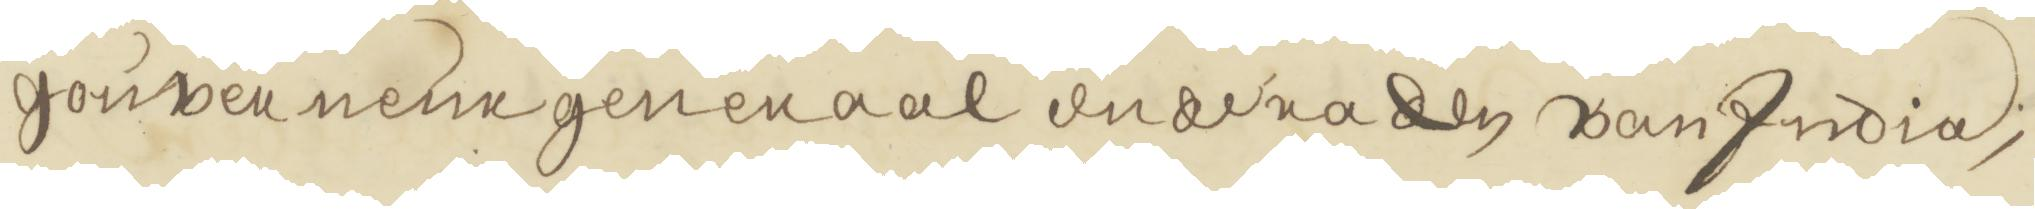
gouverneur generaal en de raden van Jndia;
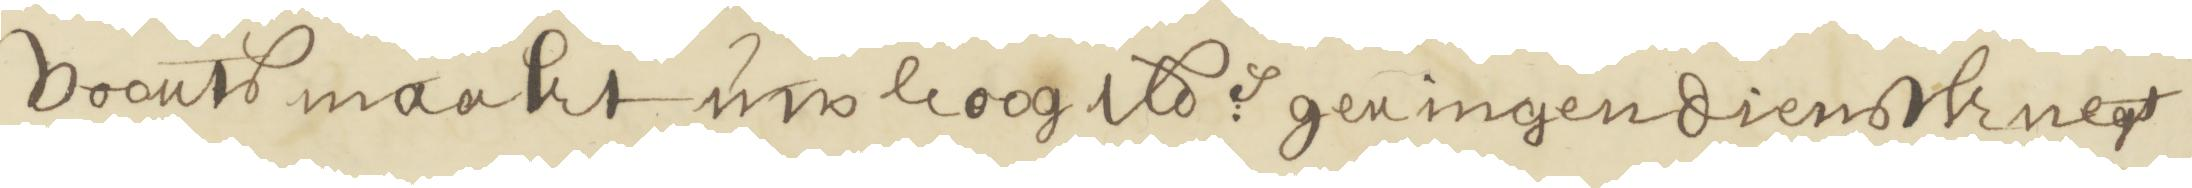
voorts maakt uw hoog Ed:s geringen dienstknegt
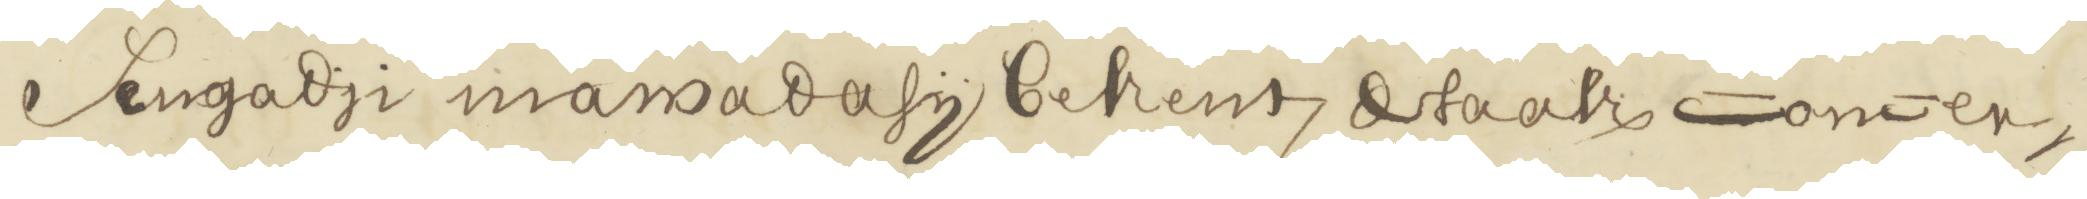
Sengadji mawadasij bekent, de saak concer„
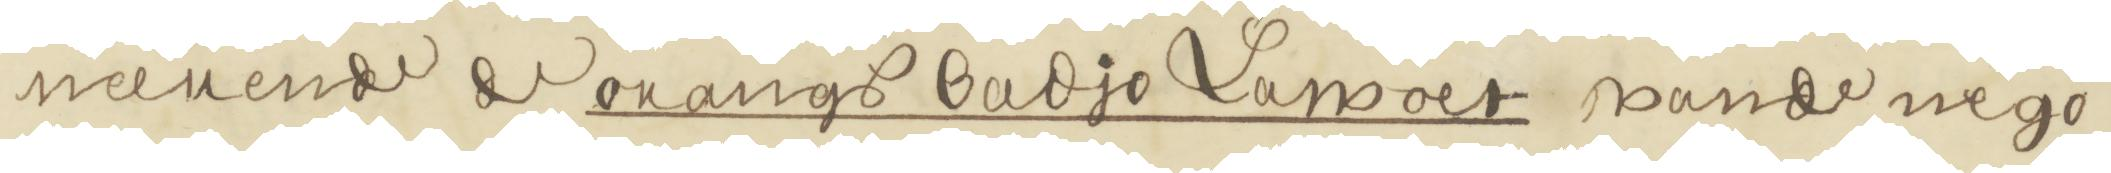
neerende de orangs badjo Lappoet van de nego
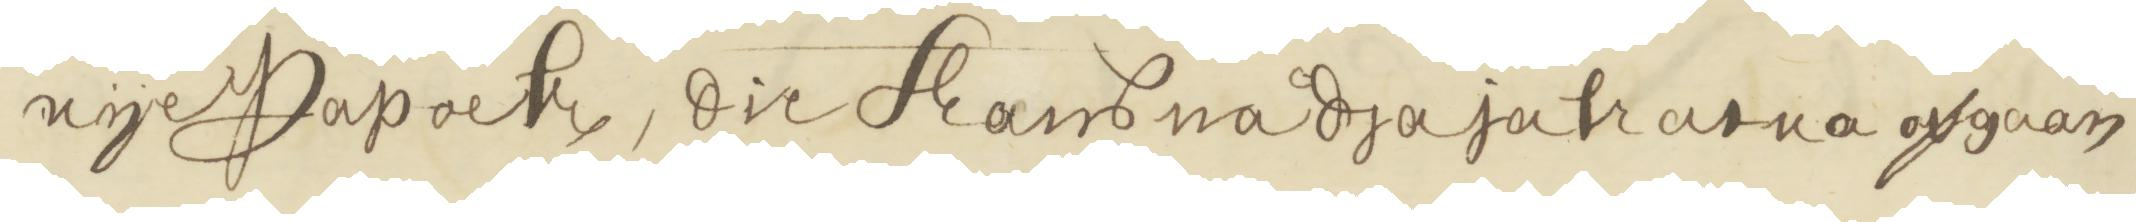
rije Papoek, die thans na djajakatra overgaan
